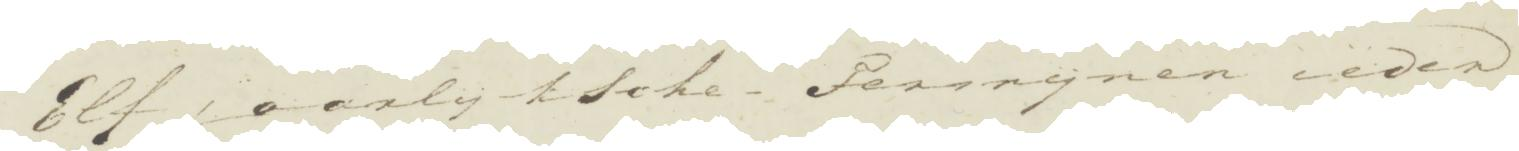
Elf jaarlijksche Termijnen ieder
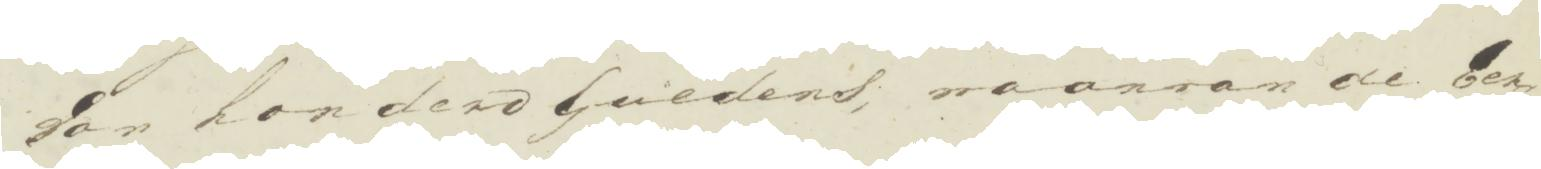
van honderd Guldens; waarvan de Eer
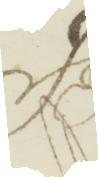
H.r
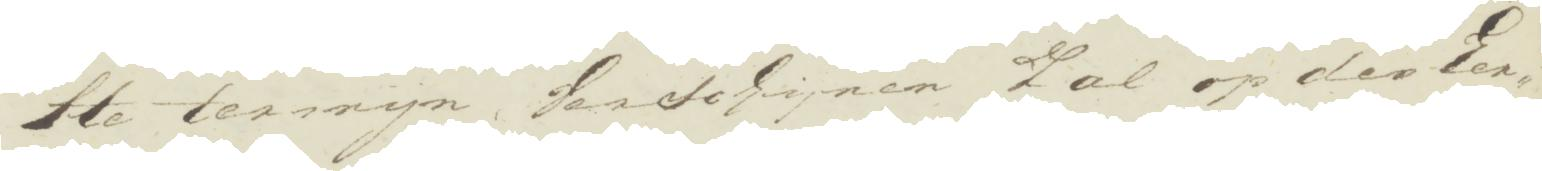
ste termijn, verschijnen zal op des Eer„
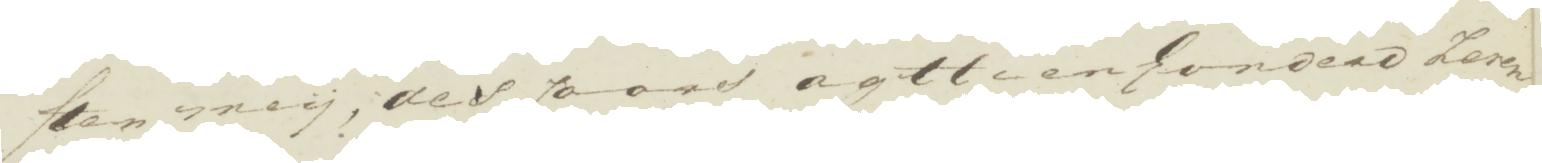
sten meij, des jaars agttienhonderd Zeven
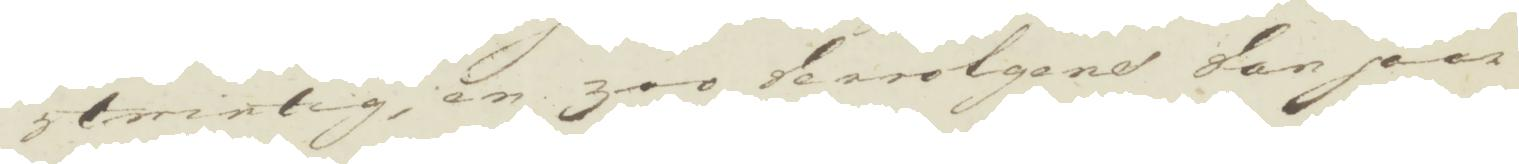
en twintig, en zoo vervolgens van jaar
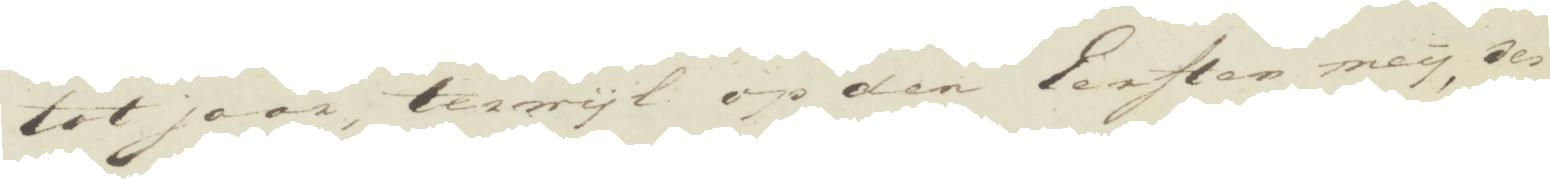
tot jaar, terwijl op den Eersten mej, des
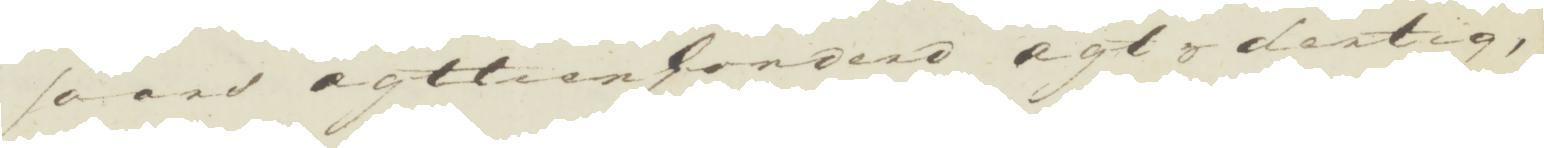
jaars agttienhonderd agt en dertig,
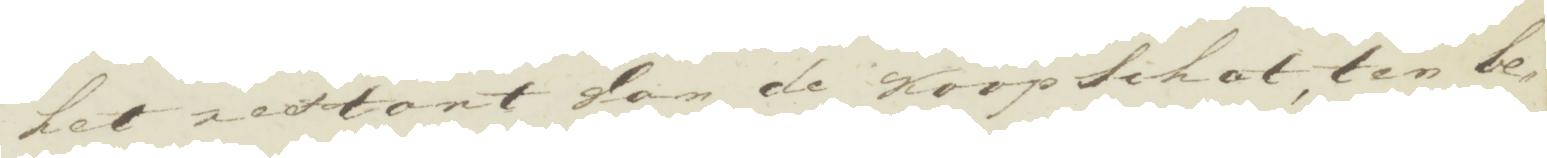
het restant van de koopschat, ten be„
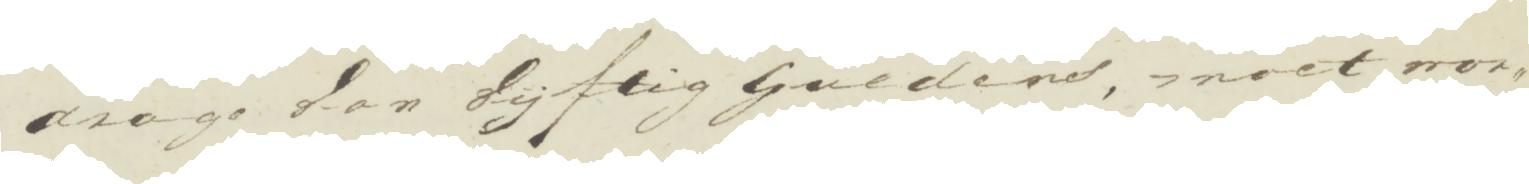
drage van vijftig Guldens, moet wor„
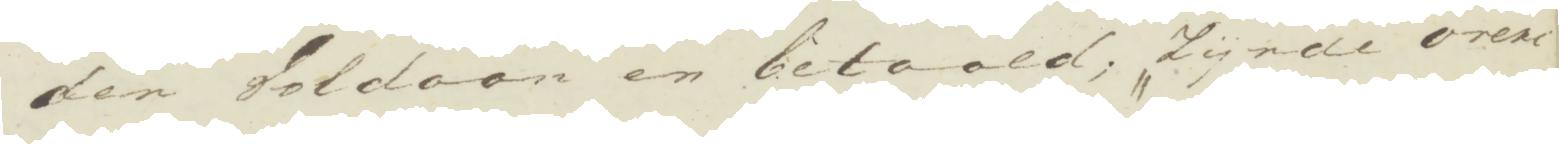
den voldaan en betaald; zijnde overi
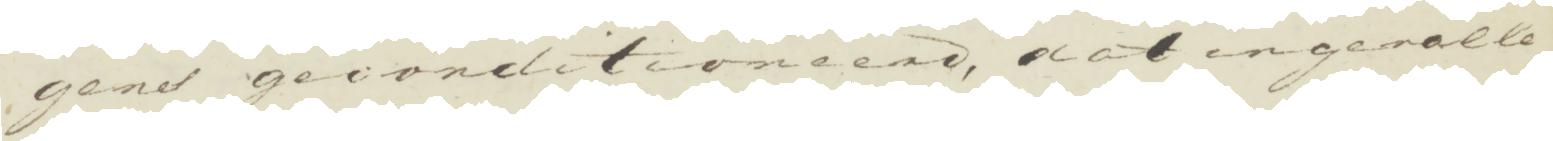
gens geconditioneerd, dat ingevalle
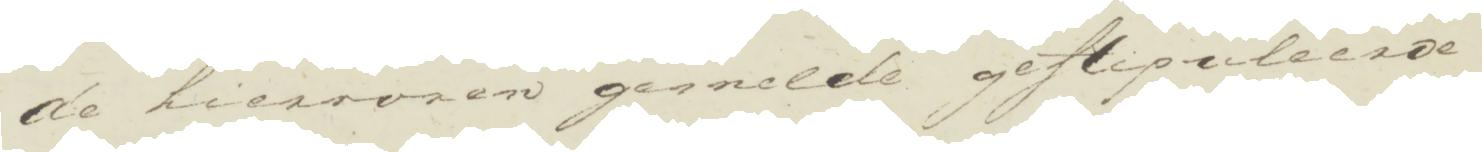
de hiervoren gemelde gestipuleerde
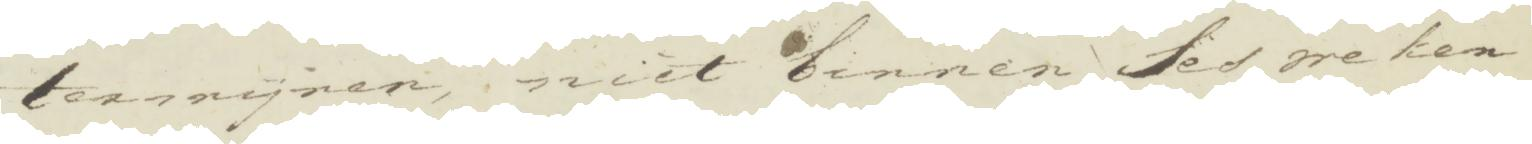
termijnen, niet binnen ses weken
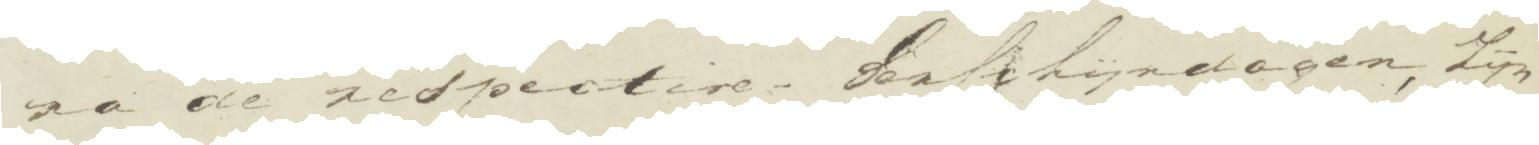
na de respective verschijndagen, zijn
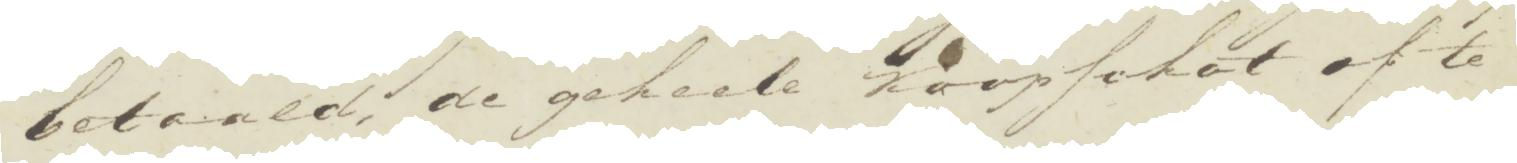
betaald, de geheele koopschat of te
